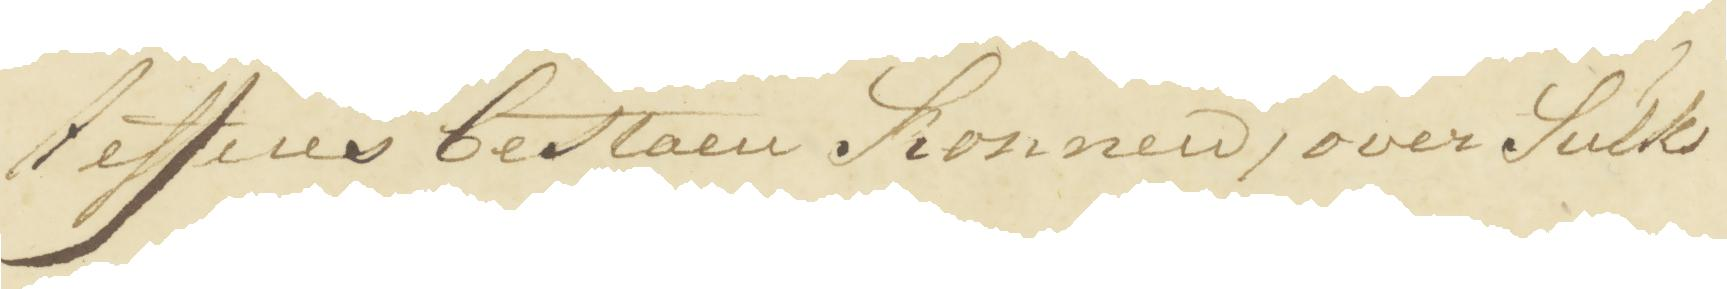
teffens bestaen konnen, over sulks
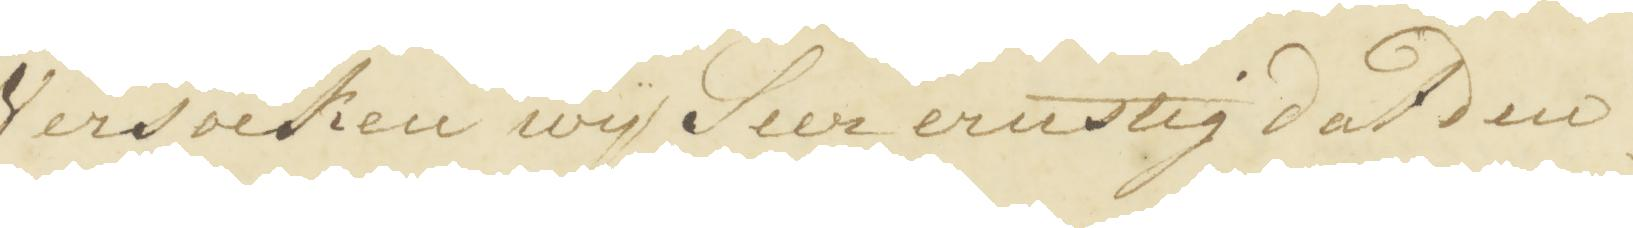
Versoeken wij seer ernstig dat den
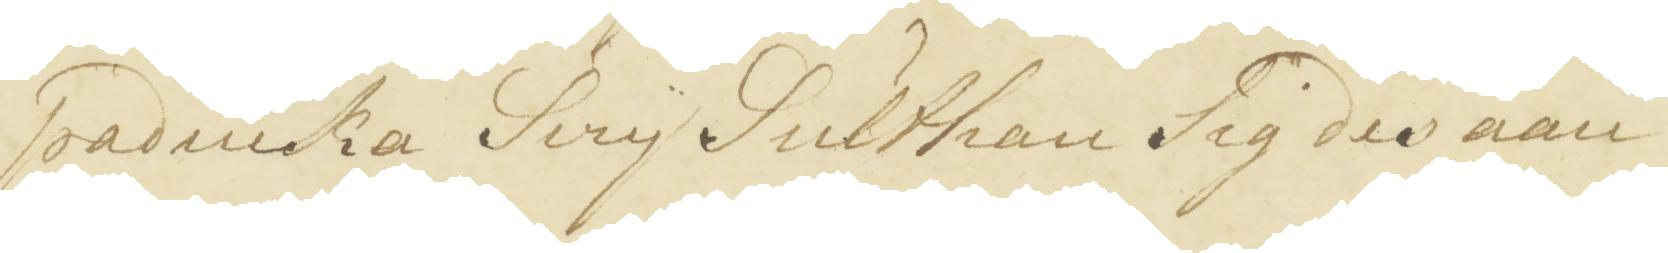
paducka sirij sulthan sig des aan
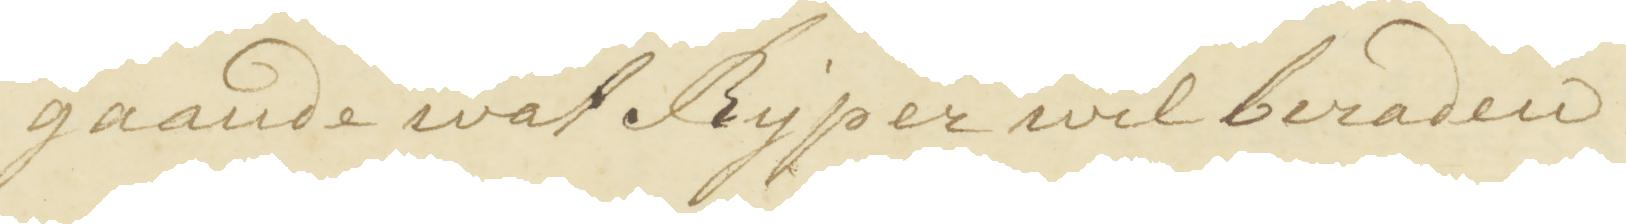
gaande wat Rijper wil beraden
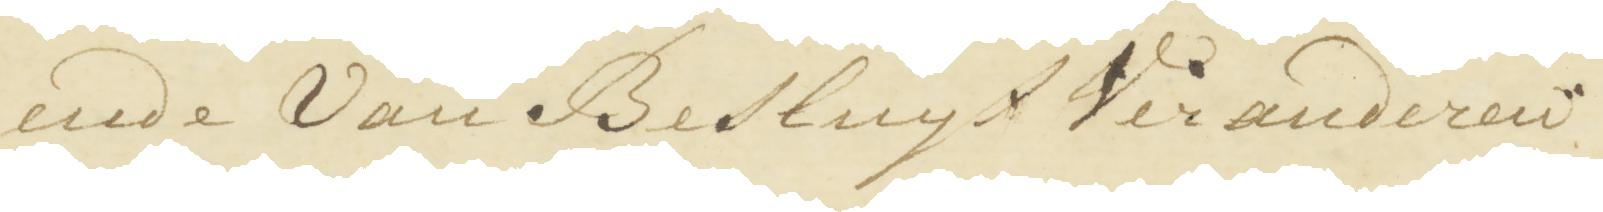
ende van Besluijt Veranderen
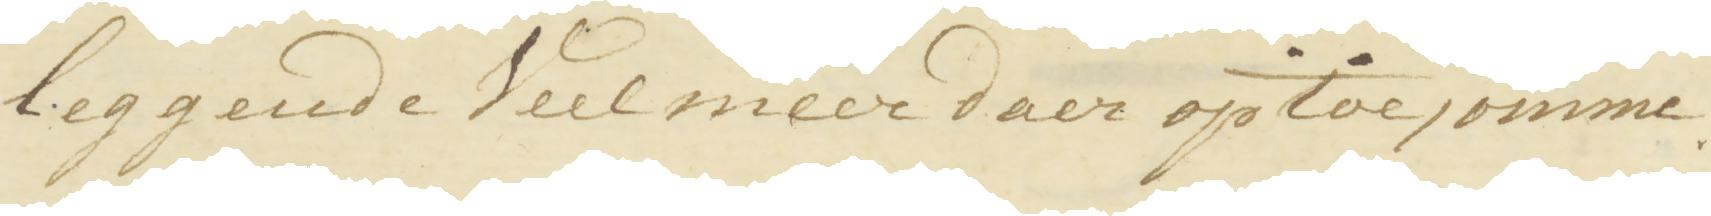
leggende Veel meer daer op toe, omme
